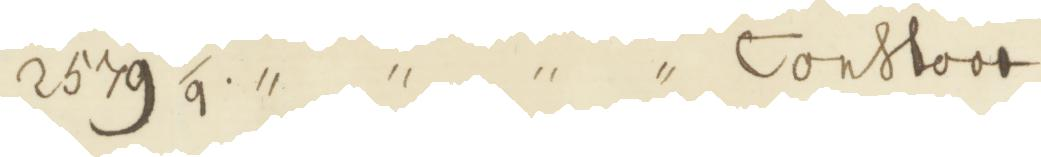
2579¾. „ „ „ „ Corsloot
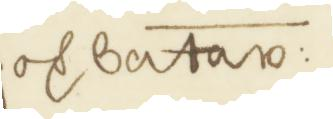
over batav:
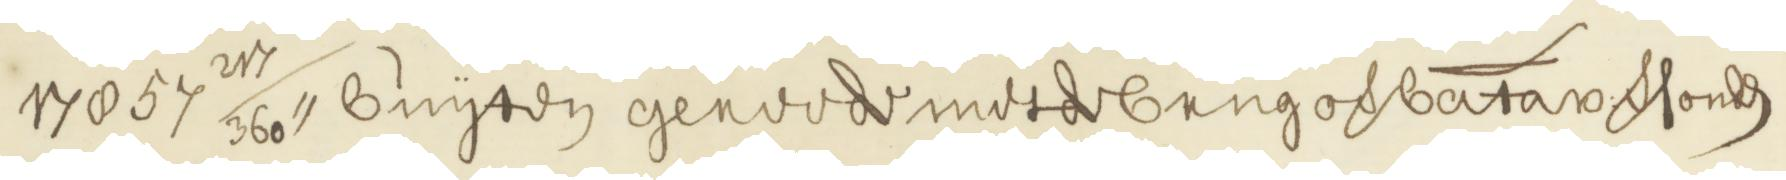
17857 217/360 „ buijten gereede met de brug over batav: versonden
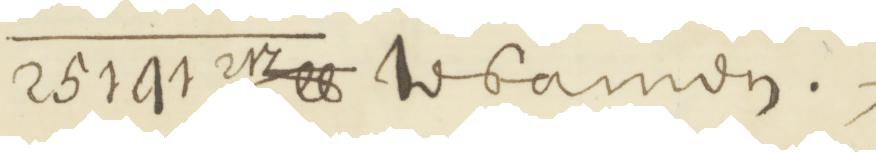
25141 217/360 lb tesamen.
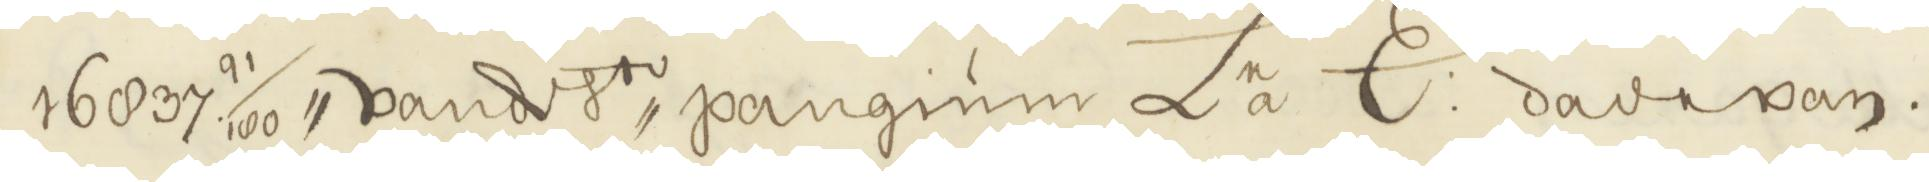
16837 91/180 „ van de s„te pangium Lar E: daer van.
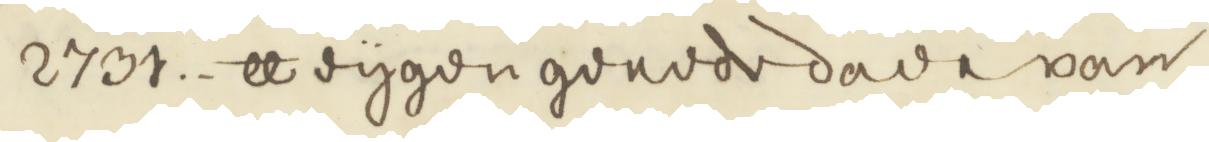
2731. — lb eijgen gerede daer van
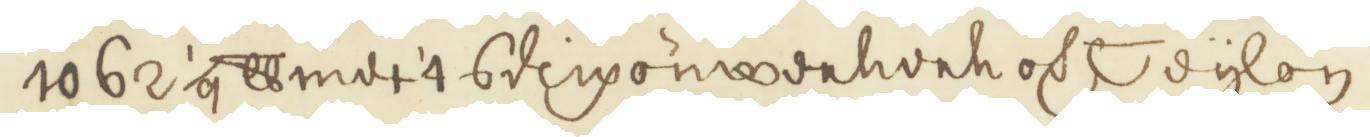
1062¼ lb met ’t schip ouwerkerk over Ceijlon
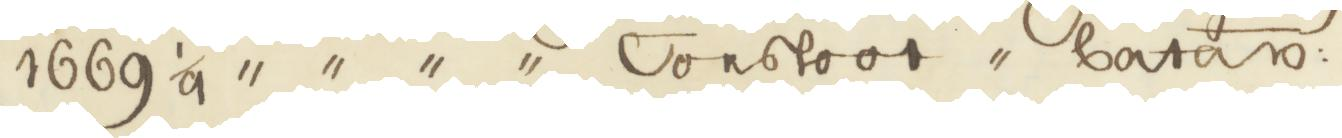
1669¼ „ „ „ „ Corsloot „ batav:
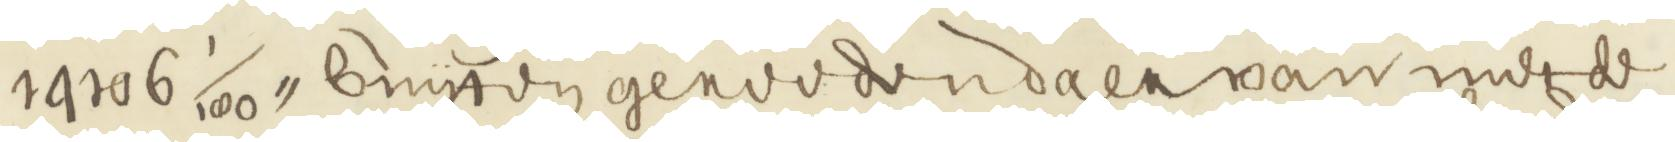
14106 1/180 „ buijten gereeden daer van met de
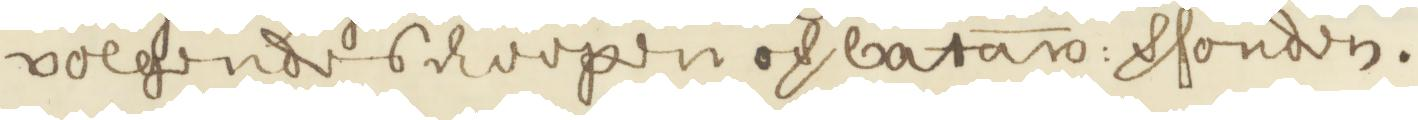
volgende scheepen over batav: versonden.
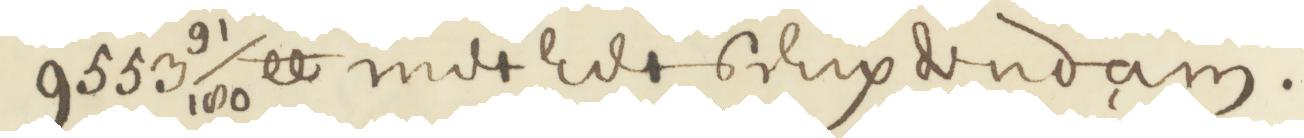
9553 91/180 lb met het schip den dam.
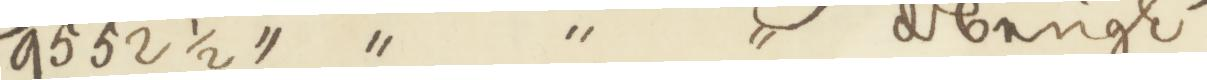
4552½ „ „ „ „ de brugh.
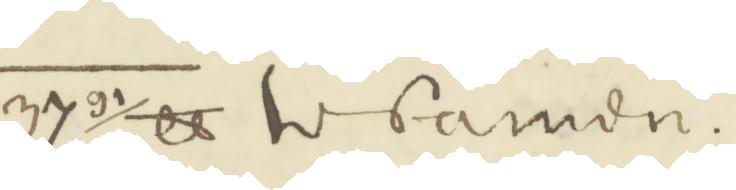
16837 91/180 lb te samen.
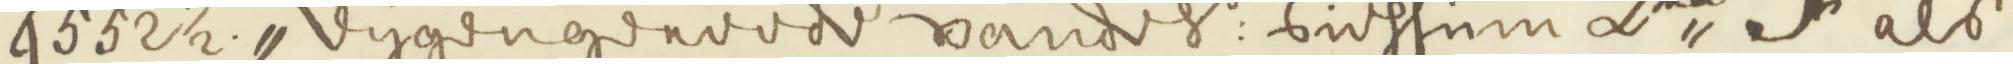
4552½. „ eijgengereede vande s:t siessum L„ra T als
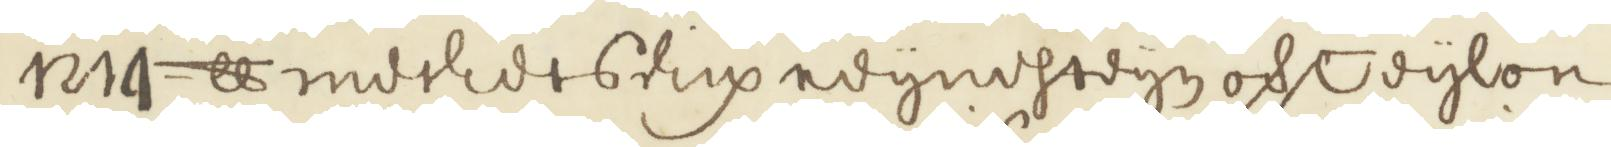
1214. lb met het schip reijnesteijn over Ceijlon
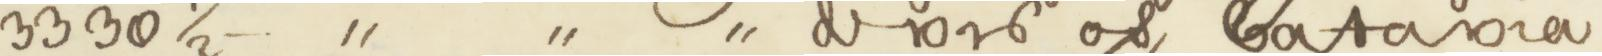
3338½ — „ „ „ de vis over batavia.
